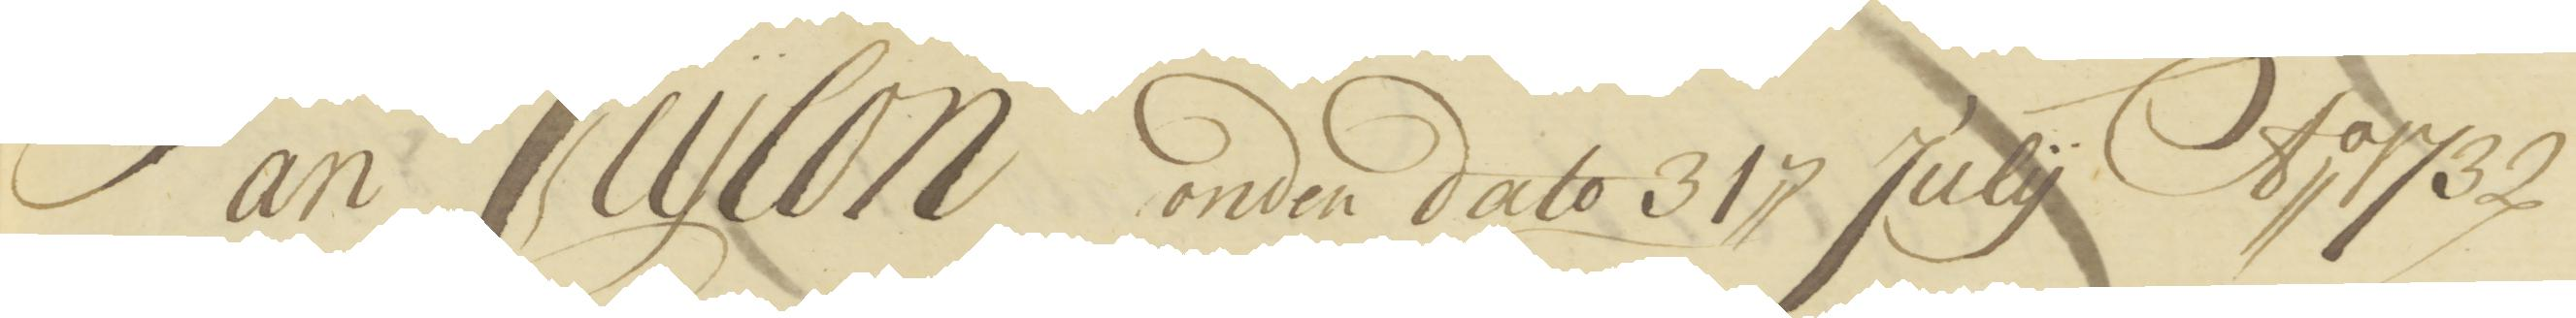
Van Ceijlon onder dato 31e Julij A„o 1732
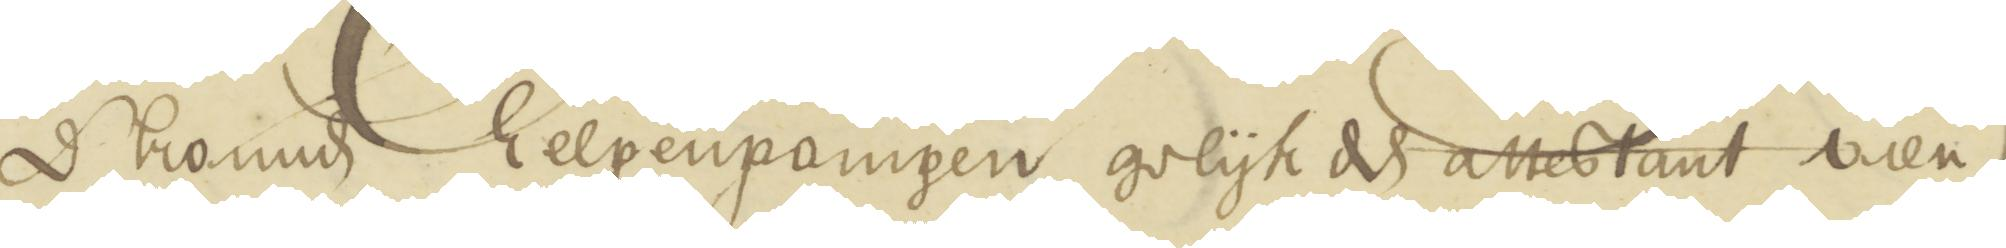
te konnen helpen pompen gelijk de attestant vier
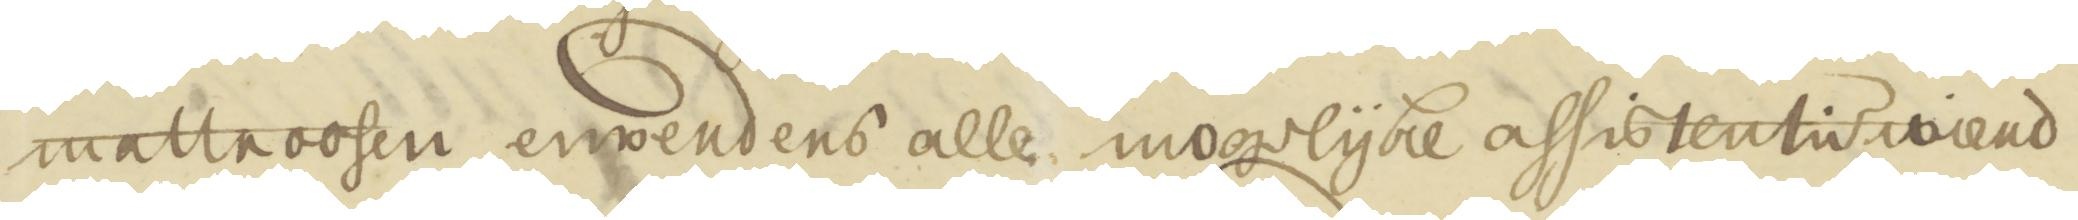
mattroosen en verders alle mogelijke assistentie wierd
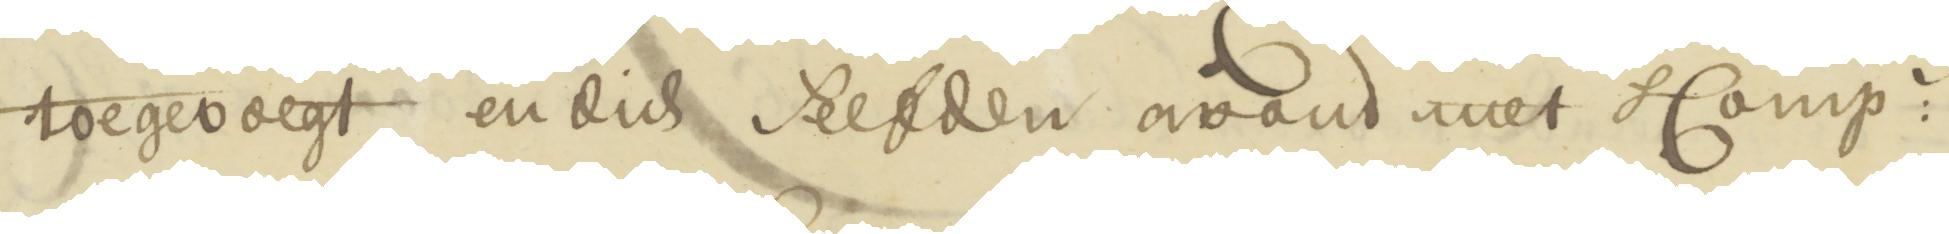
toegevoegt en dien selfden avond met 'sComp:s
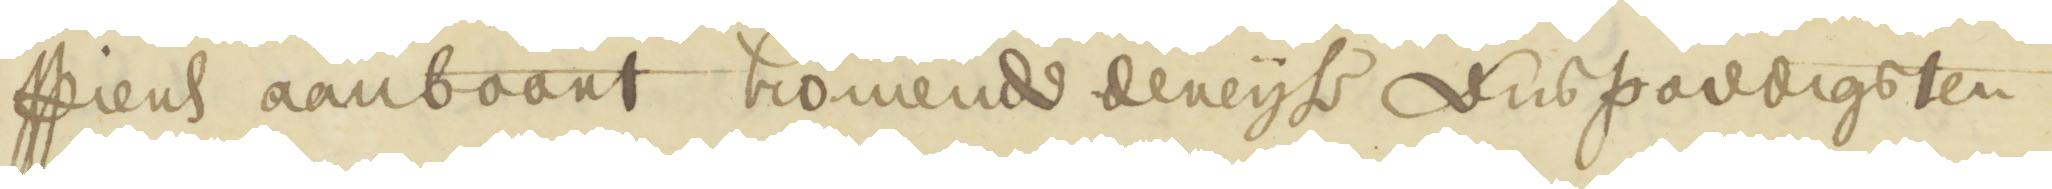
ppiers aanboort komende de reijse ten spoedigsten
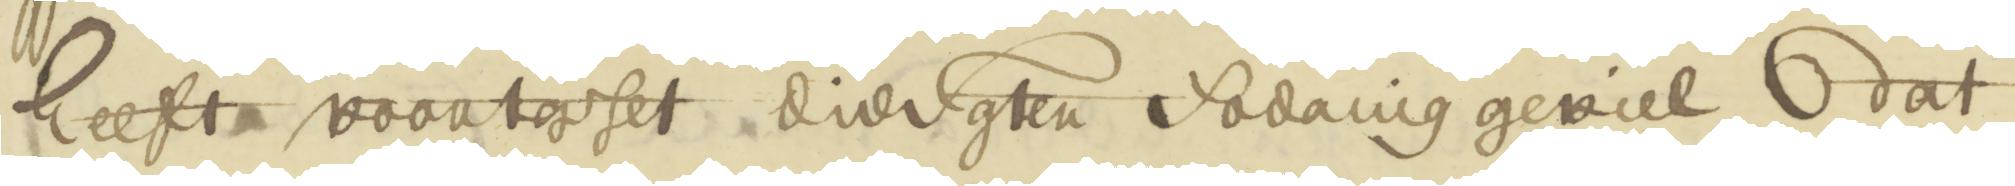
heeft voortgeset die Egter Sodanig geviel dat
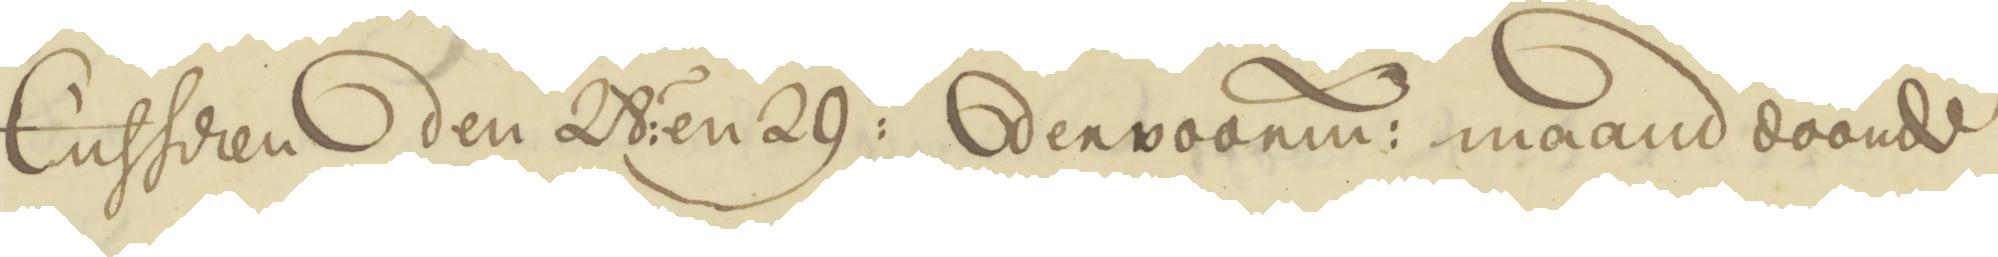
tusschen den 28:en 29:e der voorm: maand doorde
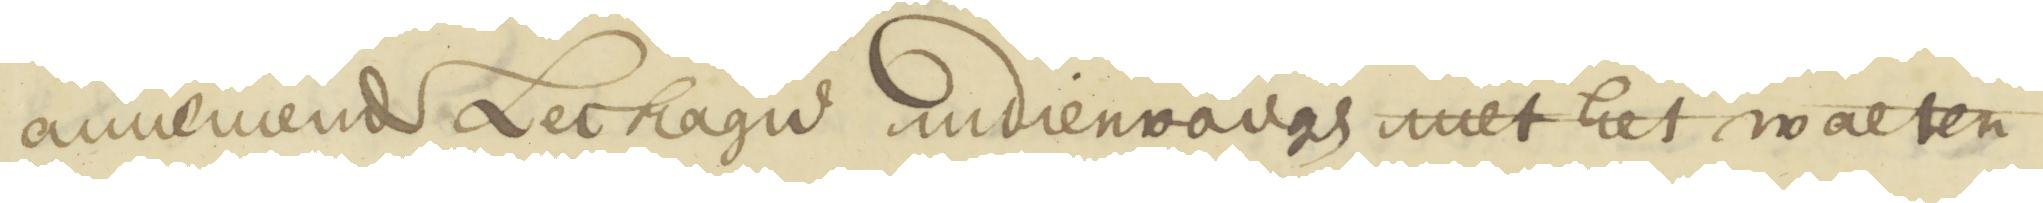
annemende Leckagie indiervoegen met het waeter
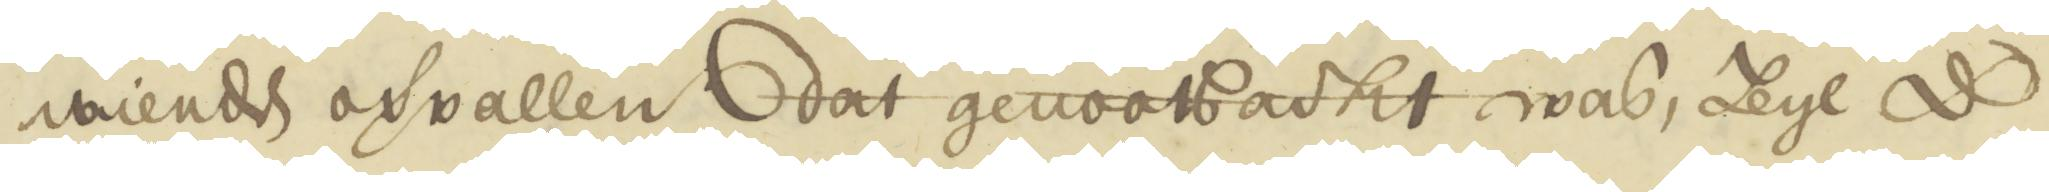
wierden overvallen dat genootsaekt was, Zeyl te
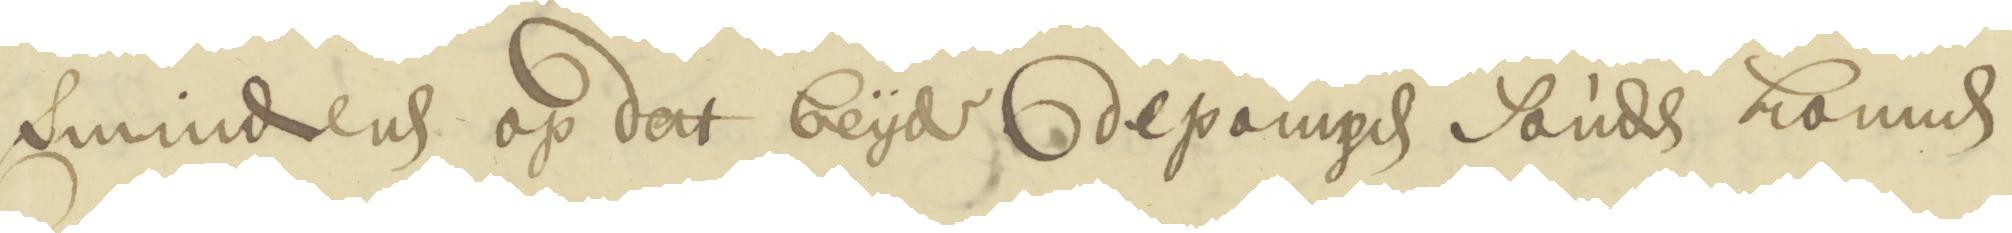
verminderen op dat beijde de pompen Souden konnen
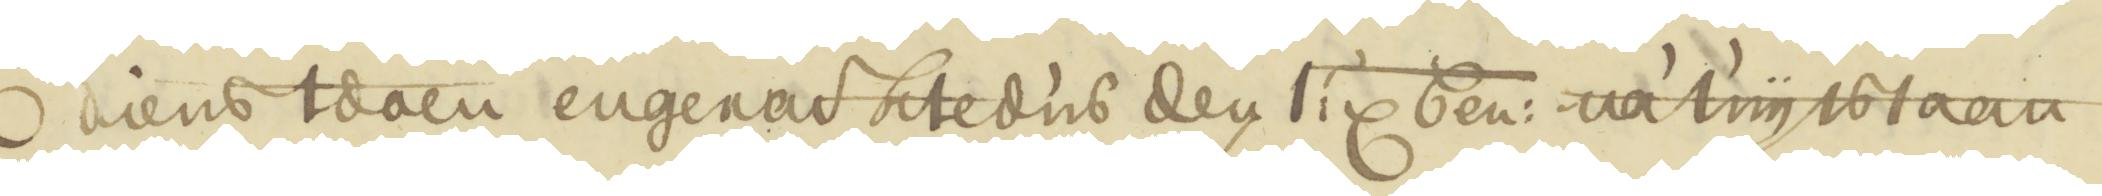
dienstdoen en geraekte dus den 1: e xber: na'tuijtstaan
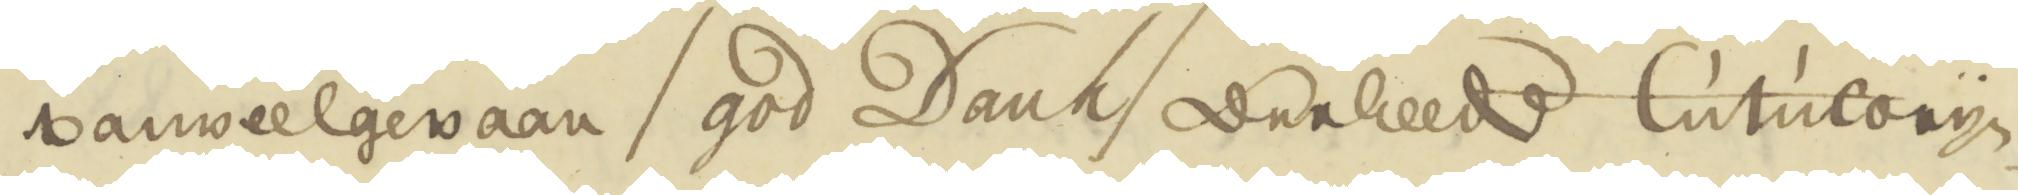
van veel gevaar / god Dank / ter rheede Tutucorijn
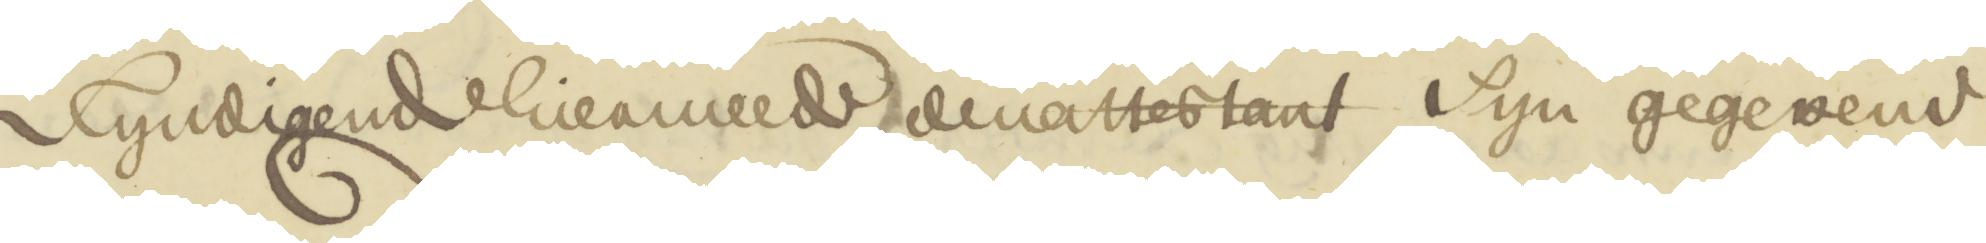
Eyndigende hiermeede den attestant Syn gegevene
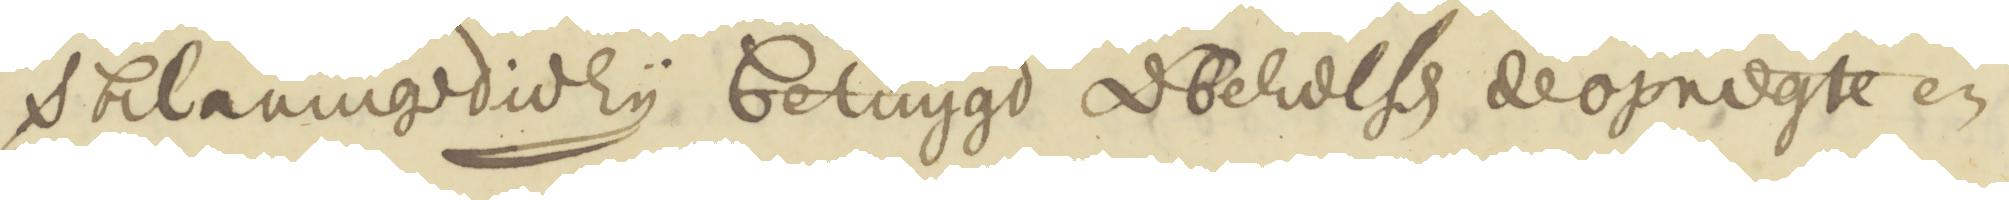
verklaringe die hij betuijgd te behelsen de opregte en
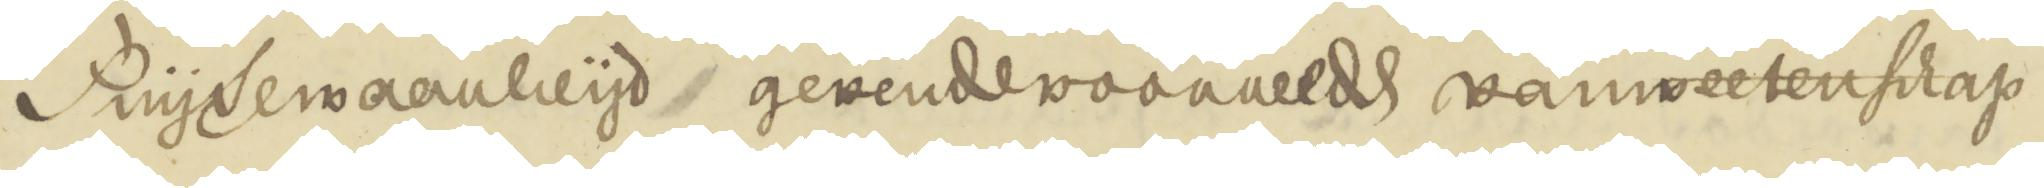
Suijvere waarheijd gevende voorreeden van weetenschap
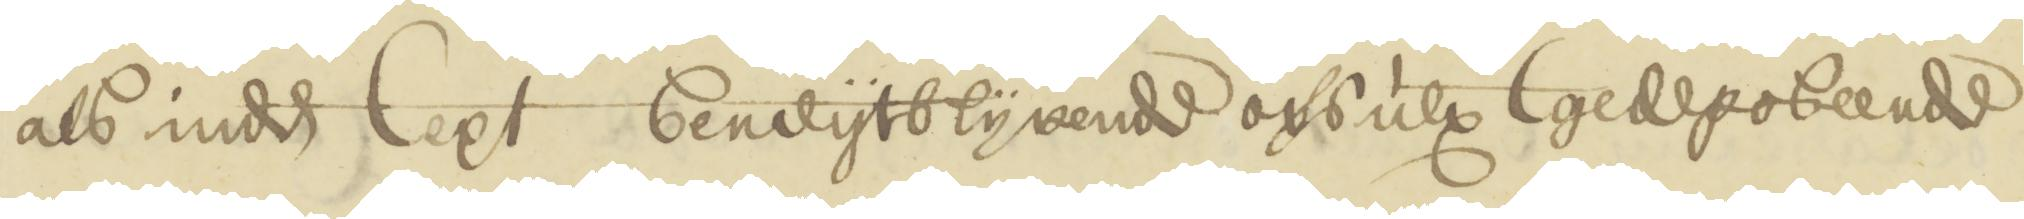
als inden Text bereijt blijvende oversulx 't gedeposeerde
